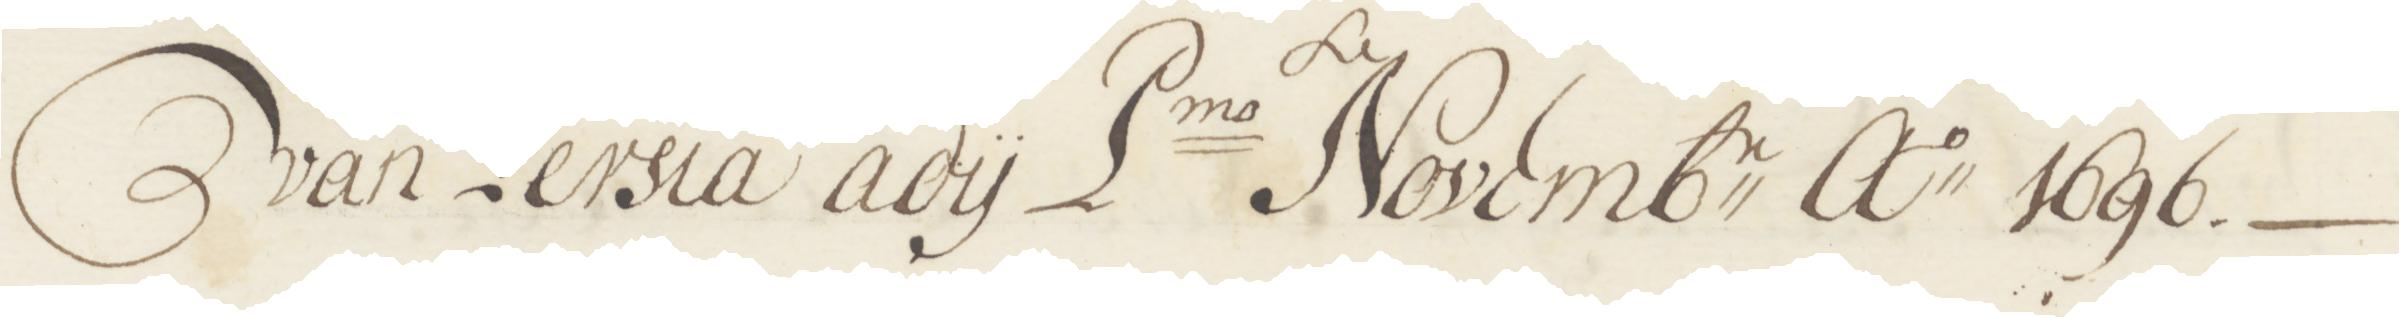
Van Persia adij P=mo Novemb„r A„o 1696. —
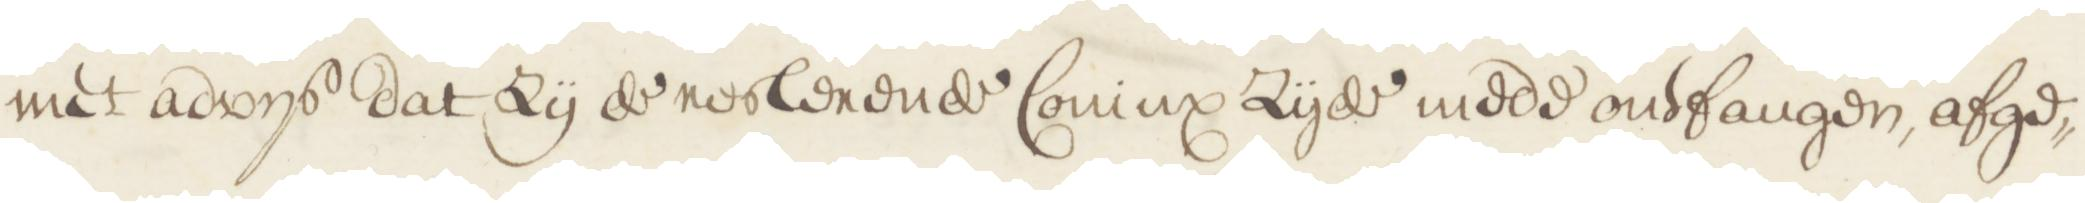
met advys dat zij de resterende Coninx zijde mede ontfangen, afge„
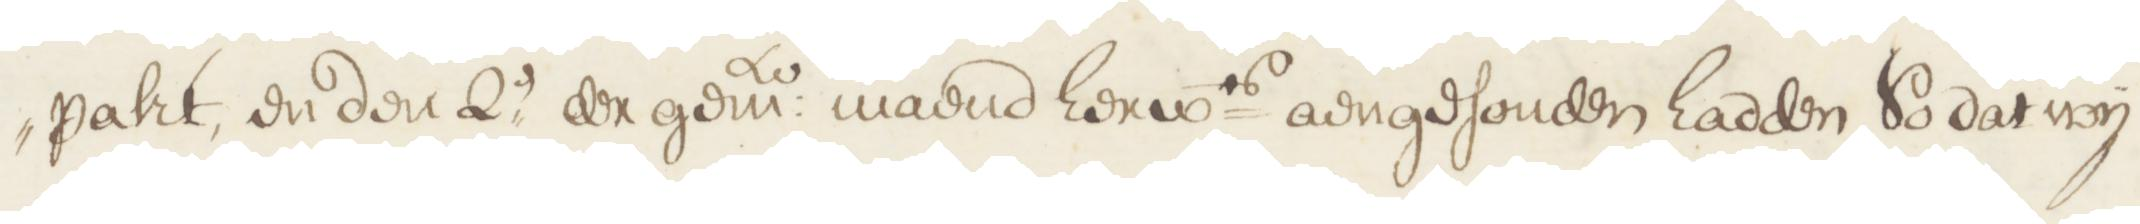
„pakt, en den 2:en der gem:te maend herw=ts aengesonden hadden, so dat wij
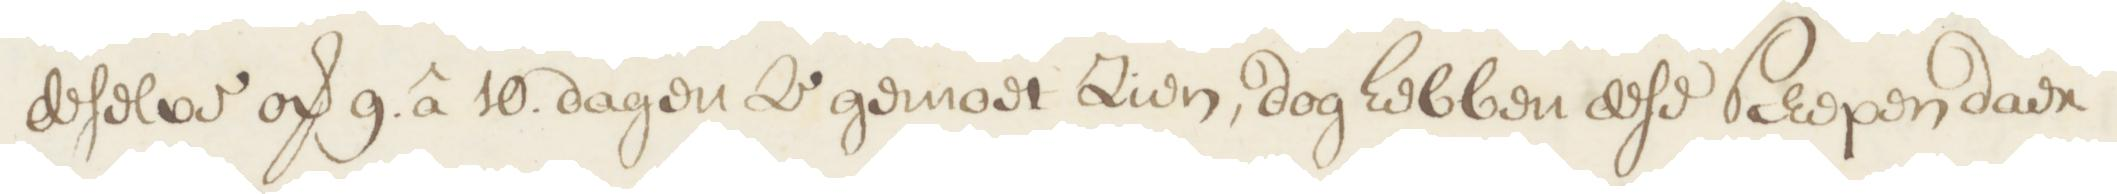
deselve over 9. â 10. dagen te gemoet zien, dog hebben dese schepen daer
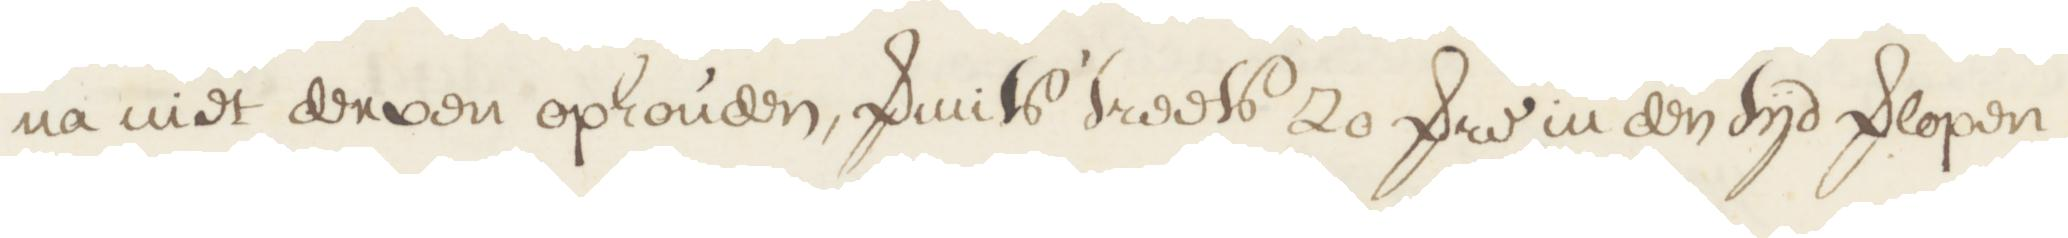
na niet derven ophouden, vermits 'treets zo verre in den tijd verlopen
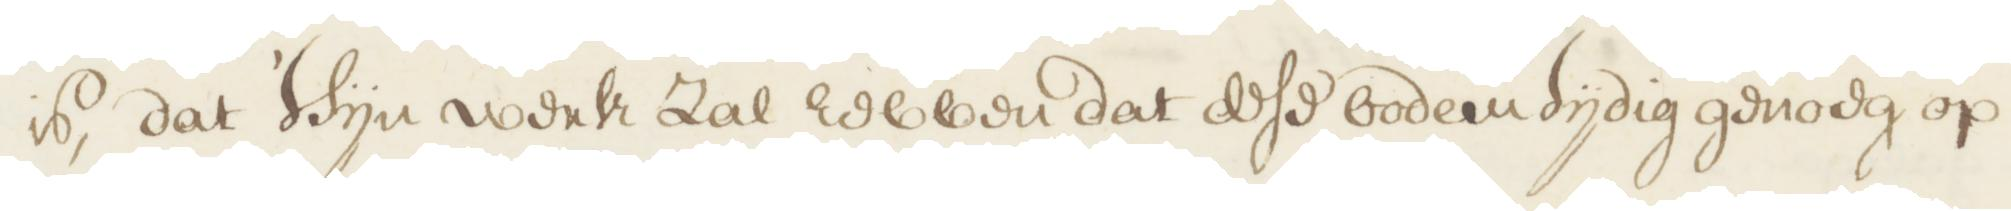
is, dat 'tsijn werk zal hebben dat dese bodem tijdig genoeg op
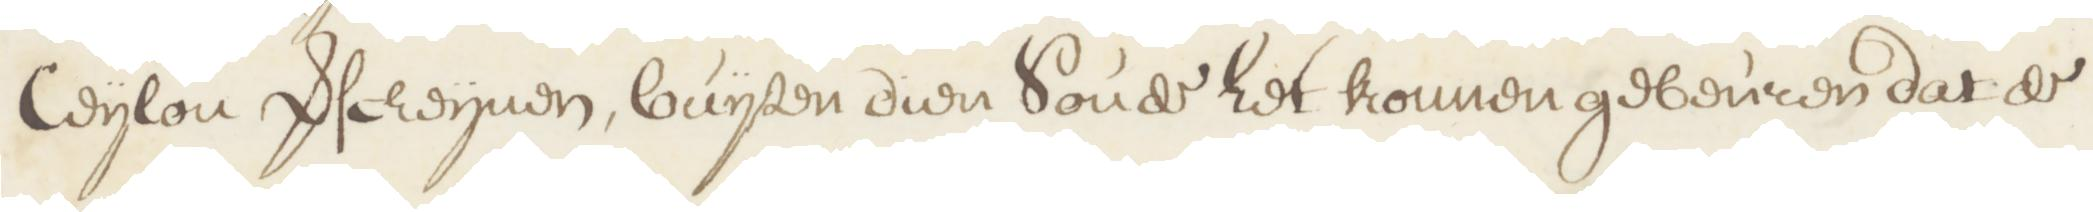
Ceijlon verscheijnen, buijten dien soude het konnen gebeuren dat de
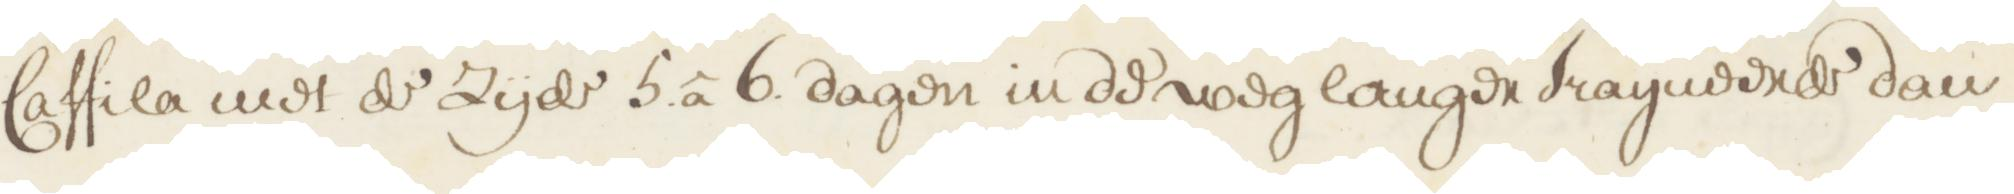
Caffila met de zijde 5. â 6. dagen in de weg langer trayneerde dan
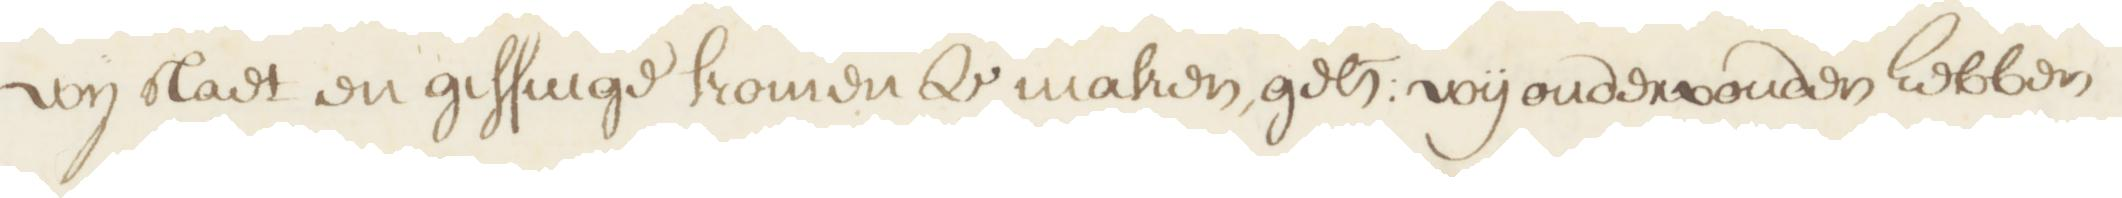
wij staet en gissinge komen te maken, gelijk wij ondervonden hebben
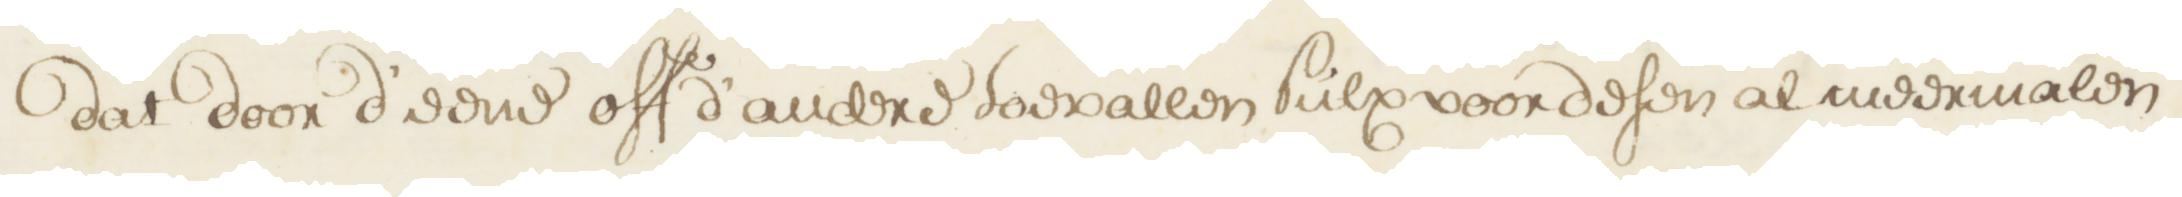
dat door d’eene off d’andere toevallen sulx voor desen al meermalen
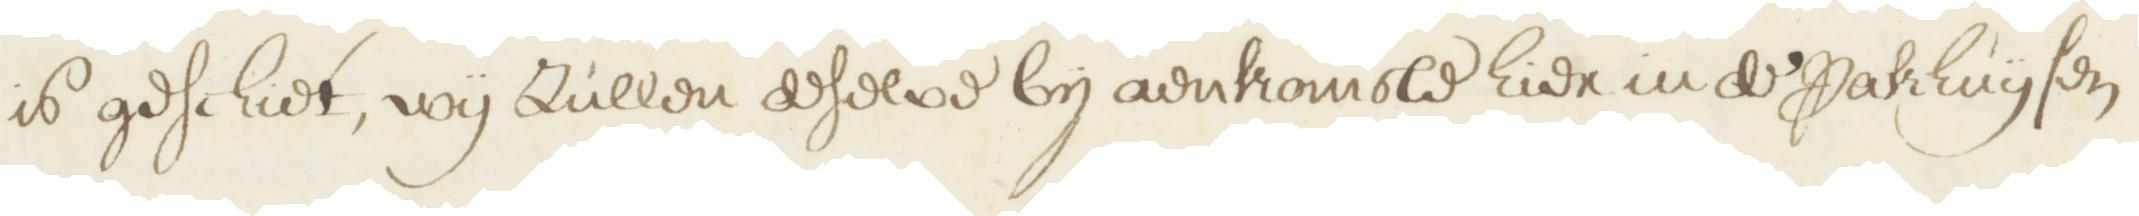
is geschiet, wij zullen deselve bij aenkomste hier in de Pakhuijsen
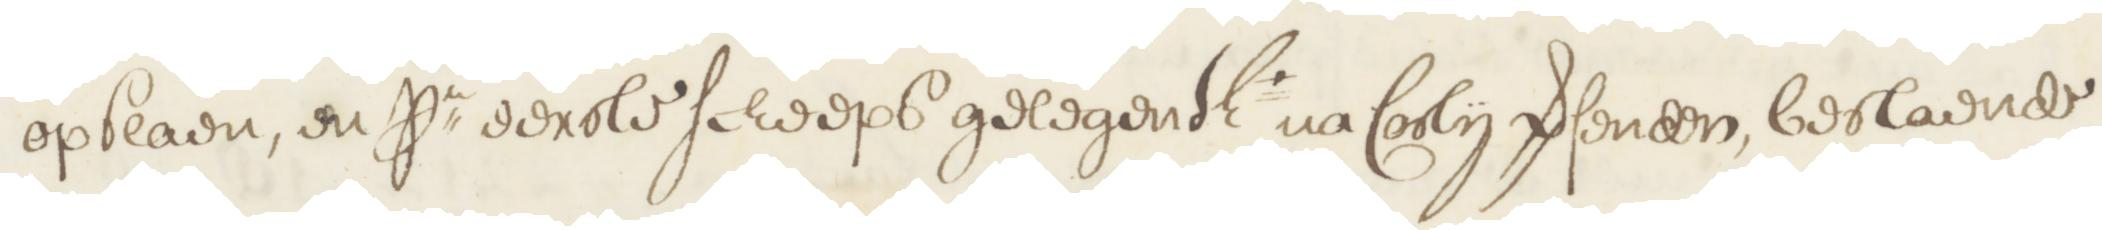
opslaen, en p„r eerste scheeps gelegenth=t na Costij versenden, bestaende
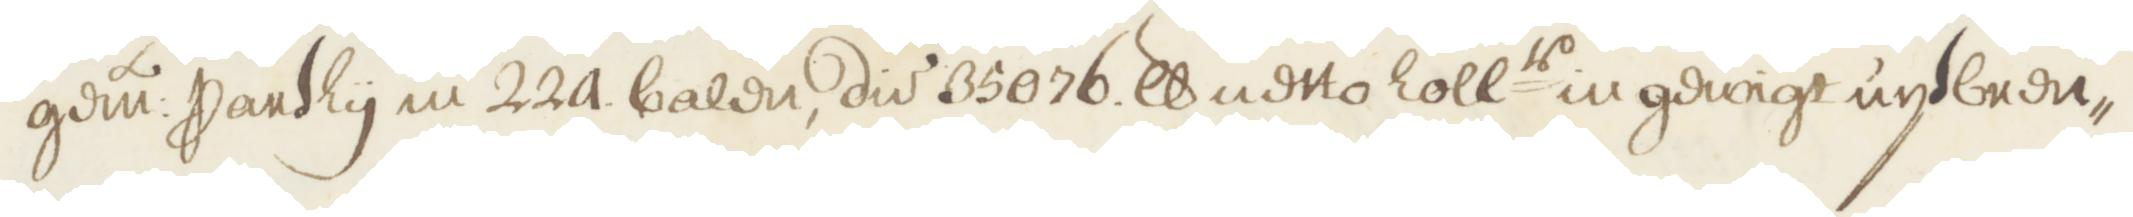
gem: parthij in 224. balen, die 35076. lb netto holl=ts in gewigt uytbren„
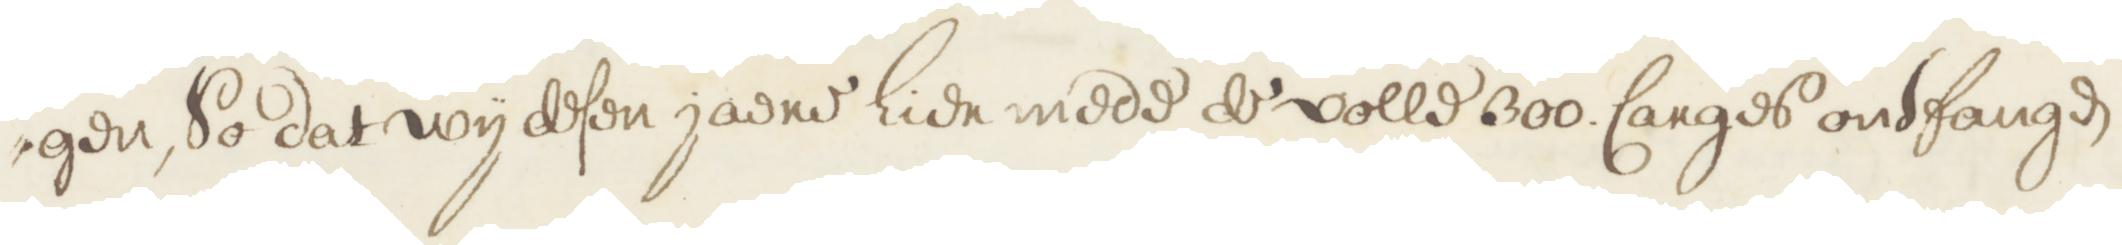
gen, so dat wij desen jaere hier mede de volle 300. Carges ontfangen
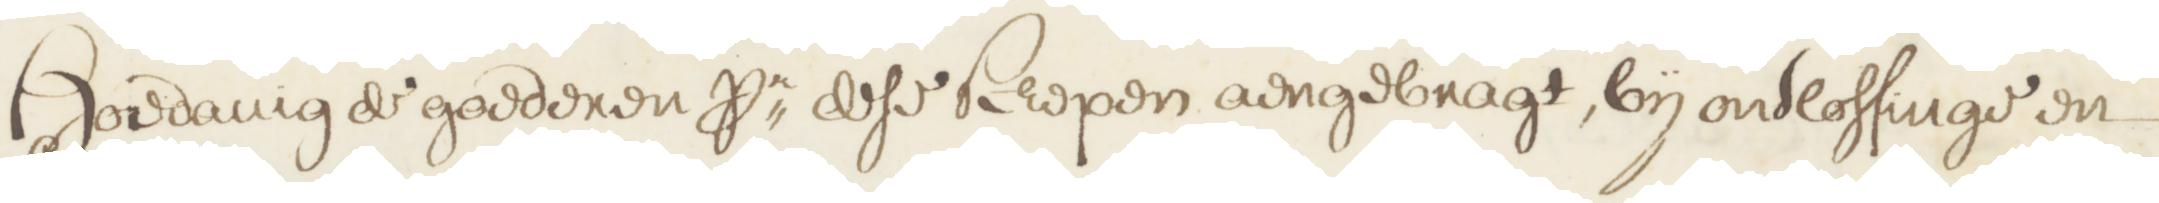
Hoedanig de goederen P„r dese schepen aengebragt, bij ontlossinge en
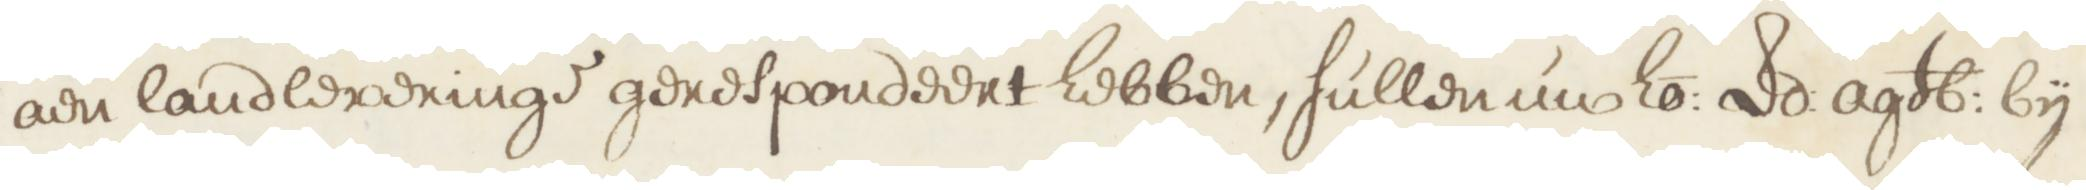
aen landleveringe gerespondeert hebben, sullen uw ho: Ed: agtb: bij
